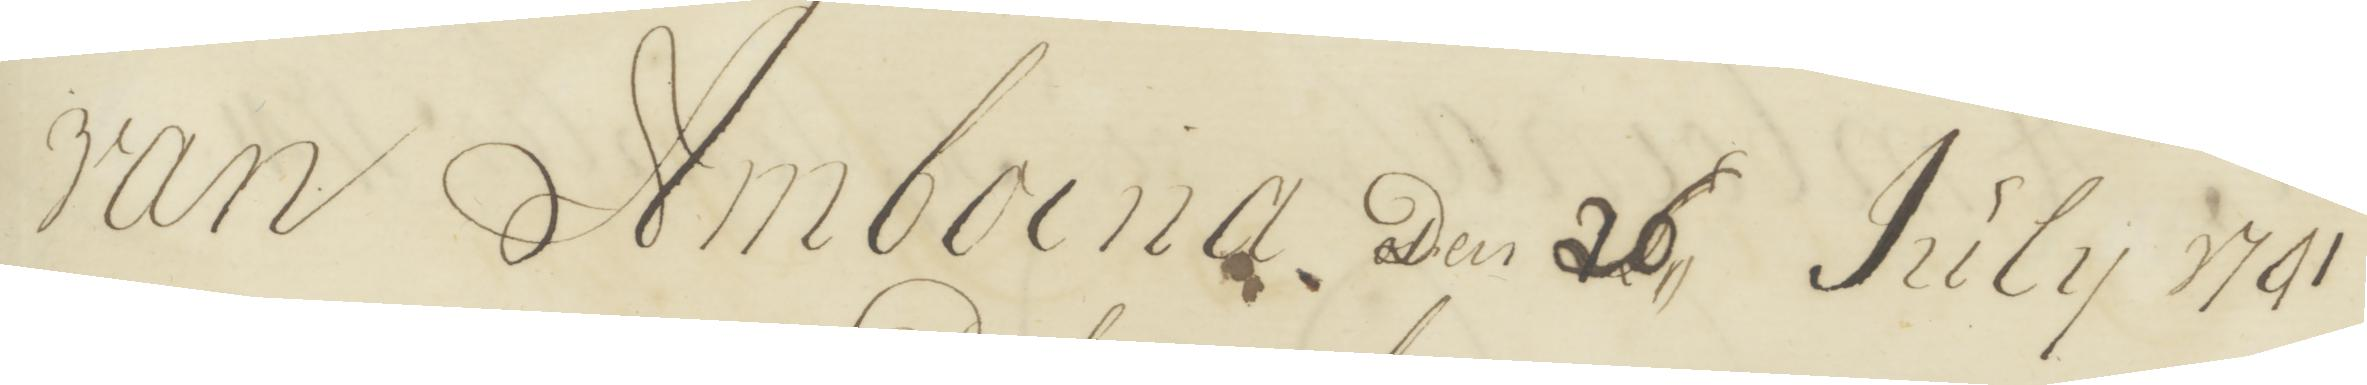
van Amboina Den 26'„ Iuly 1741
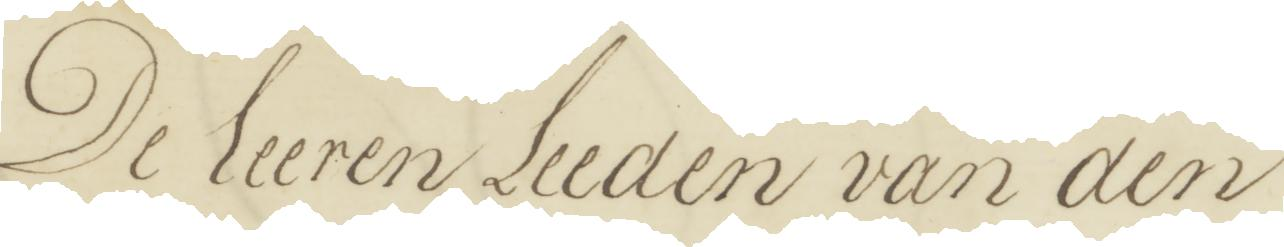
De heeren Leeden van den
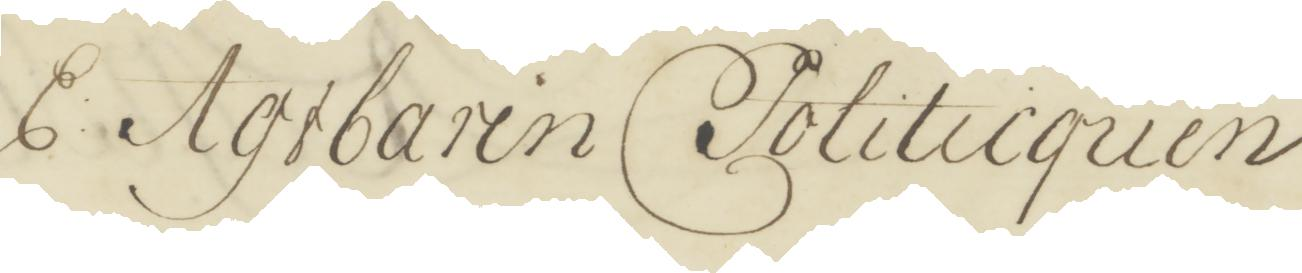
E: Agtbaren Politicquen
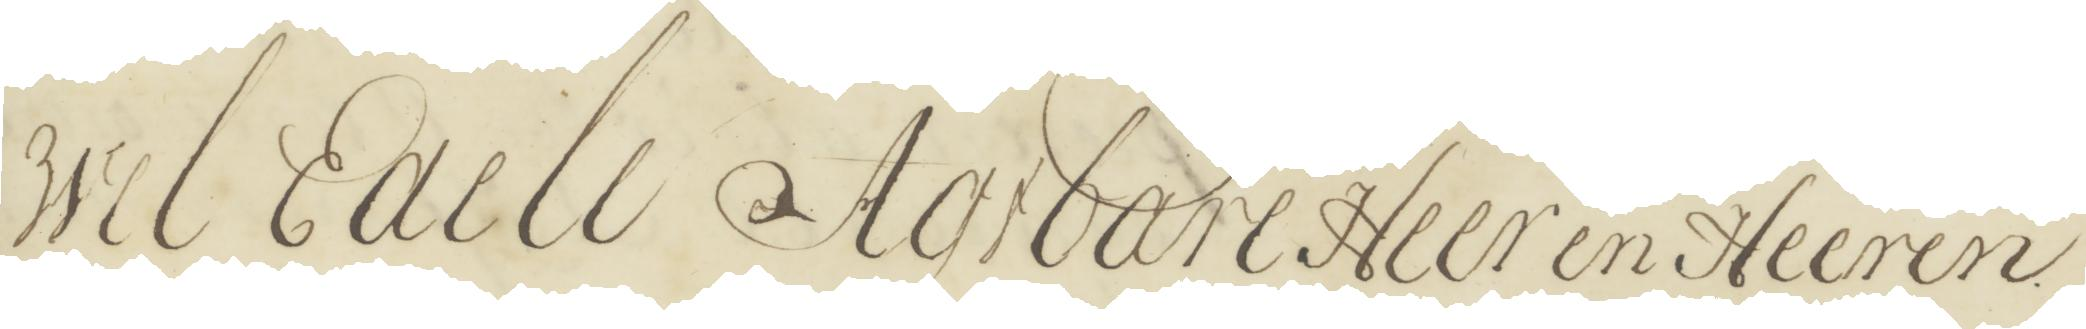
wel Edele Agtbare Heer en Heeren
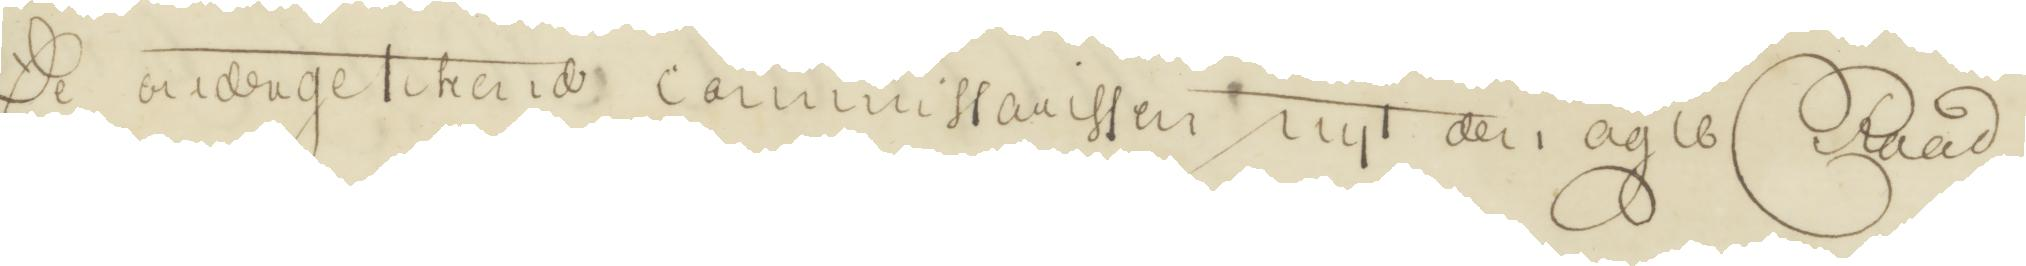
De ondergetekende commissarissen uyt den agtb Raad
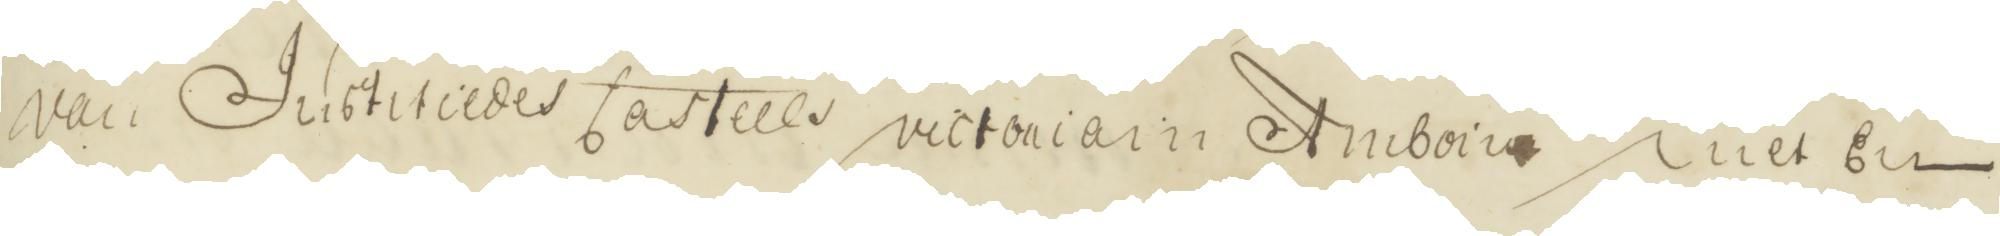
van Iustitie des Casteels victoria in Amboina met En
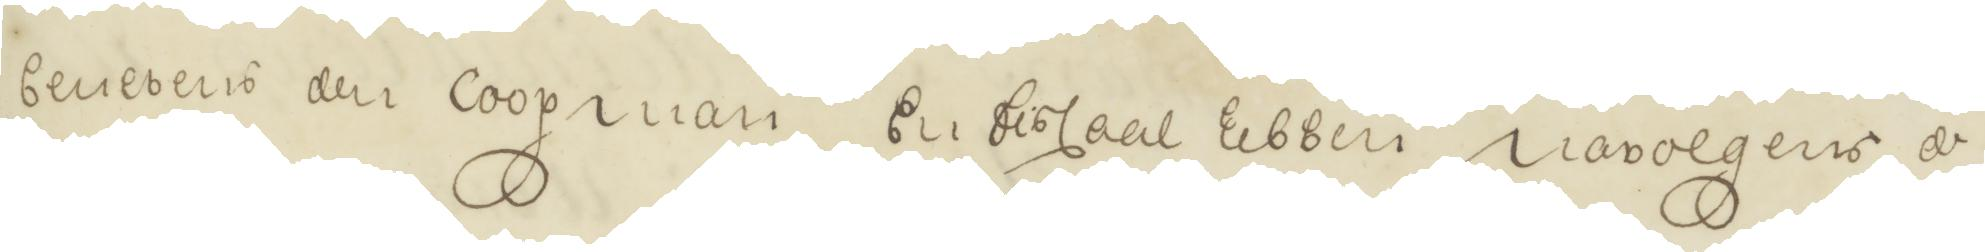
benevens den coopman En fiscaal hebben navolgens de
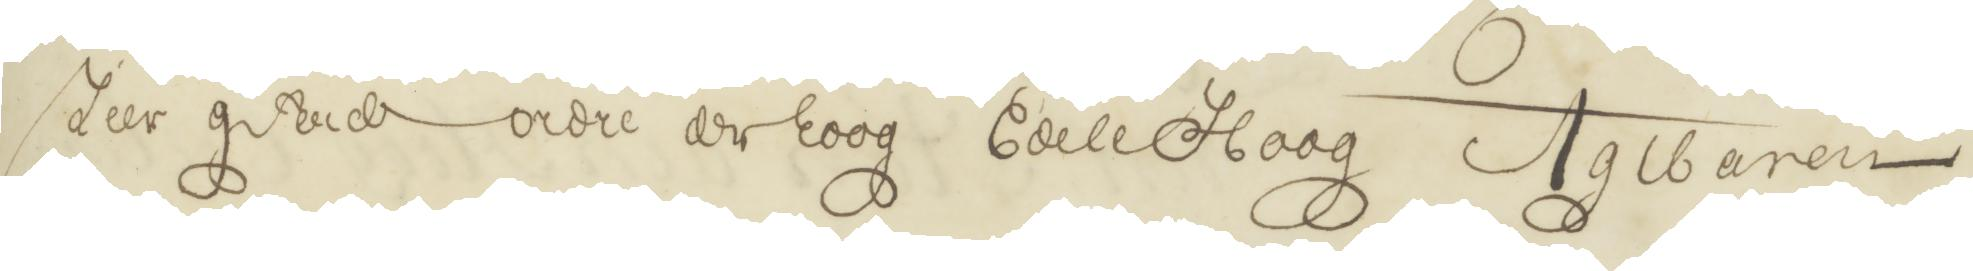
Zeer g'eerde ordre der hoog Edele Hoog Agtbaren
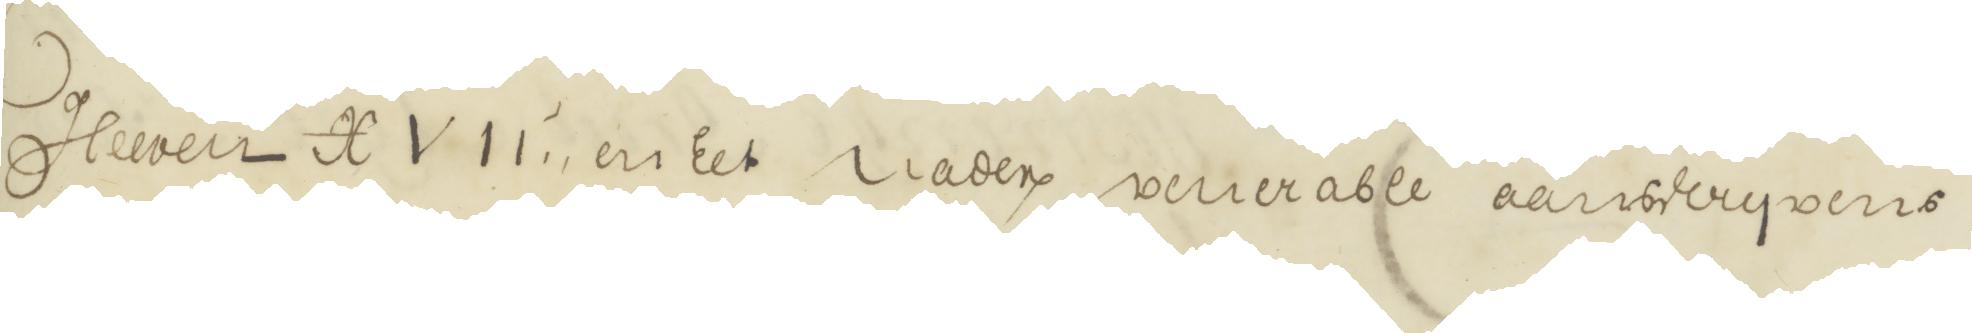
Heeren XVII en het nader venerable aanschryvens
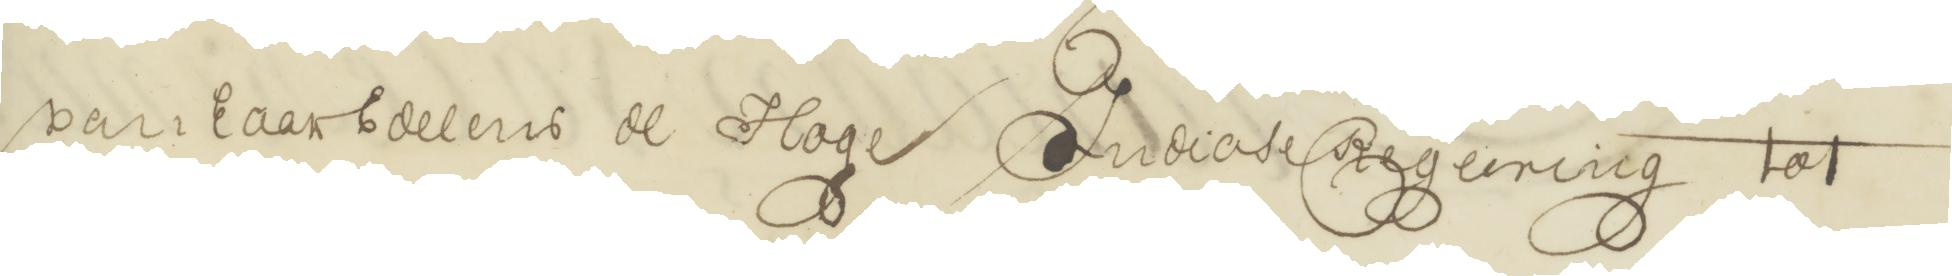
van haar Edelens de Hoge Indiase Regeering tot
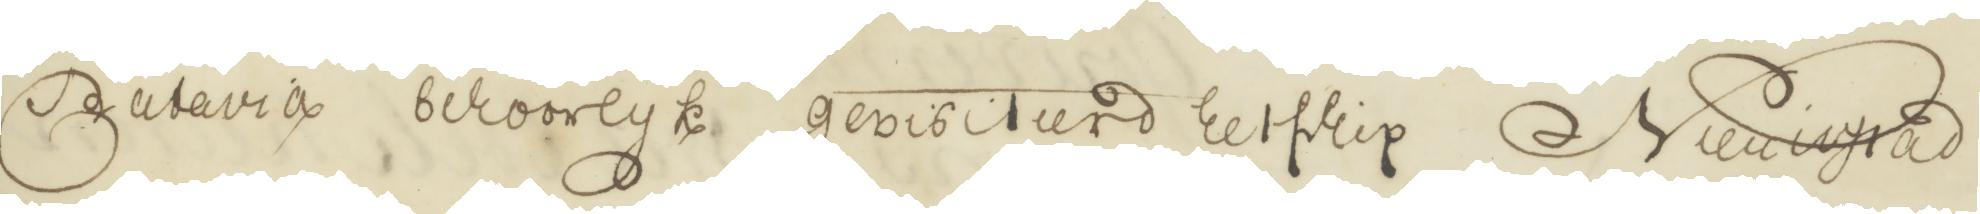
Batavia behoorlyk gevisiteerd het schip Nieuwstad
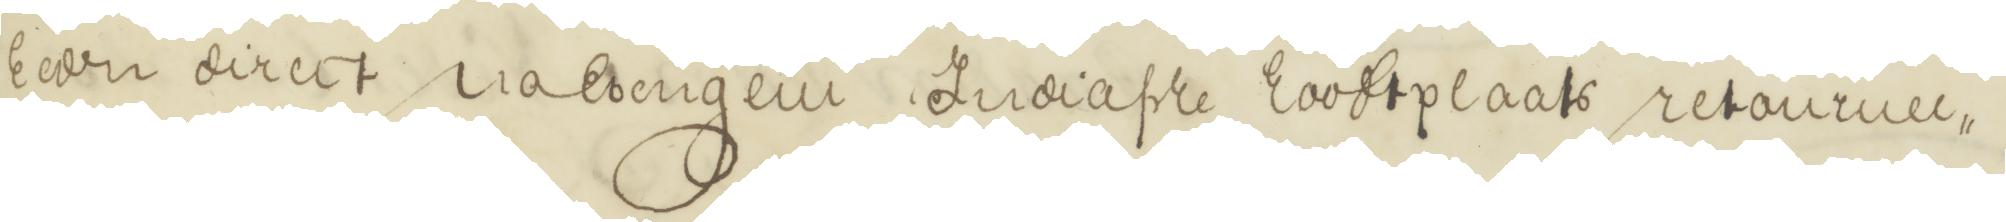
heden direct na evengem Indiasche hooftplaats retournee„
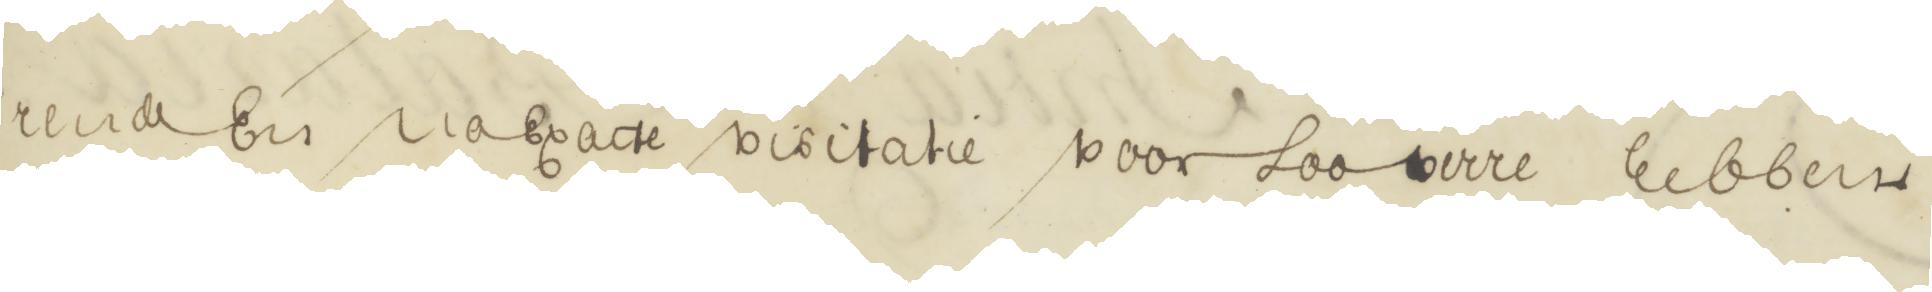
rende En na exacte visitatie voor Soo verre hebben
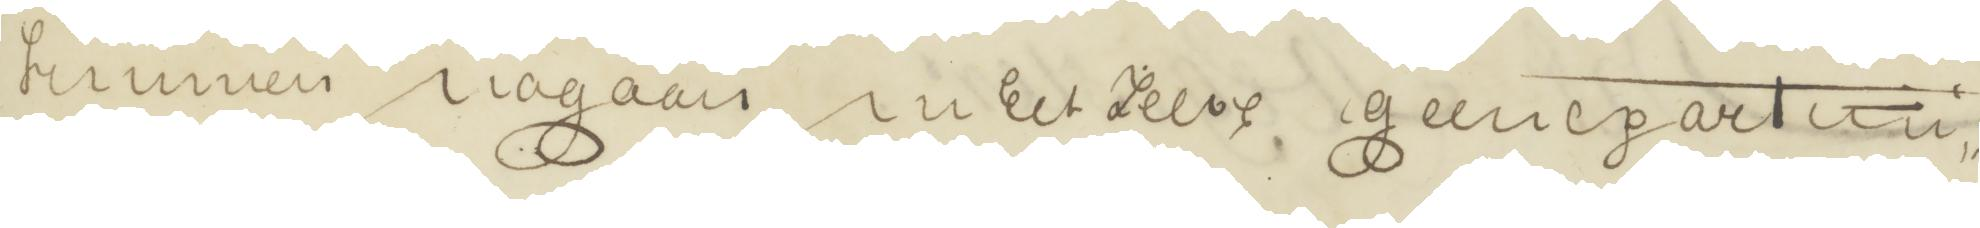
kunnen nagaan in het Zelve geene particu„
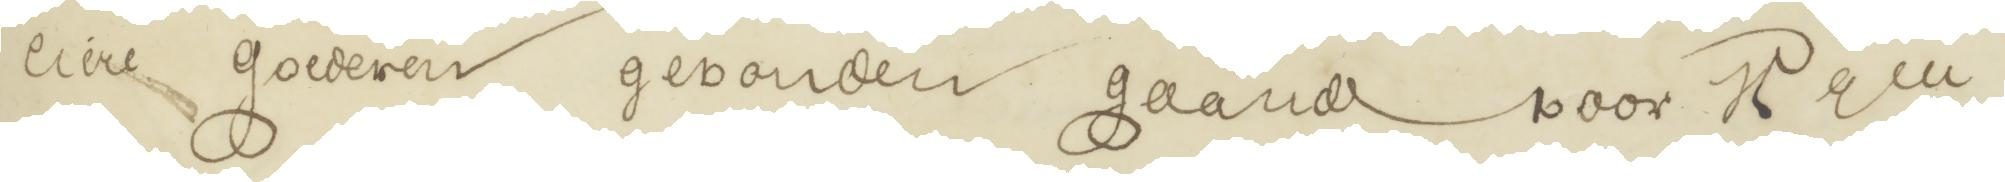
liere goederen gevonden gaande voor 15 r„m
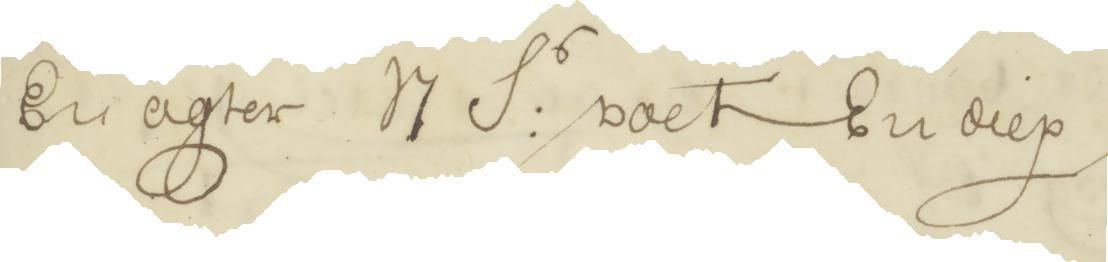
En agter 17 S:s voeten diep
